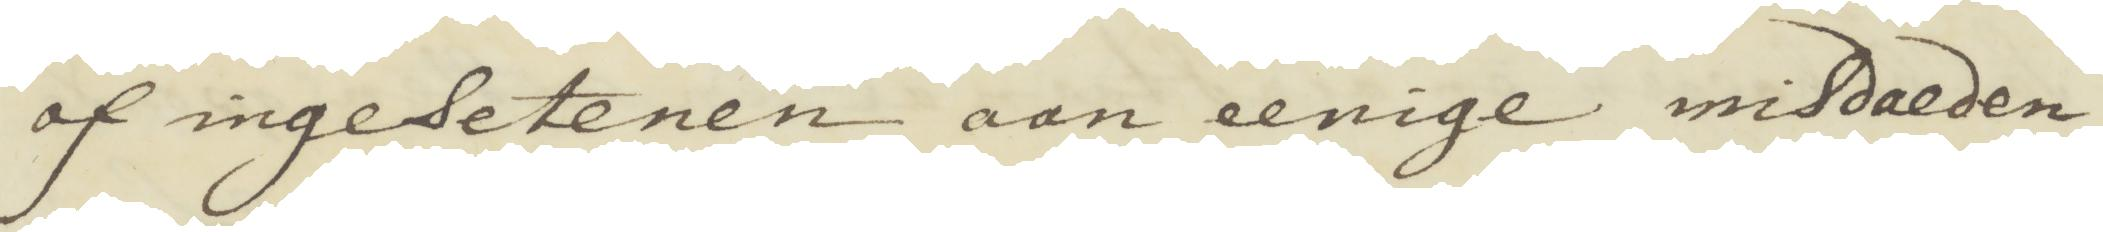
of ingesetenen aan eenige misdaeden
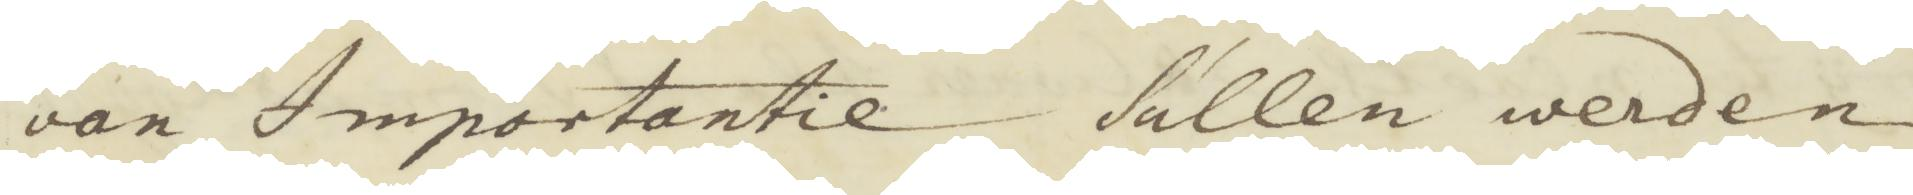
van Importantie sullen werden
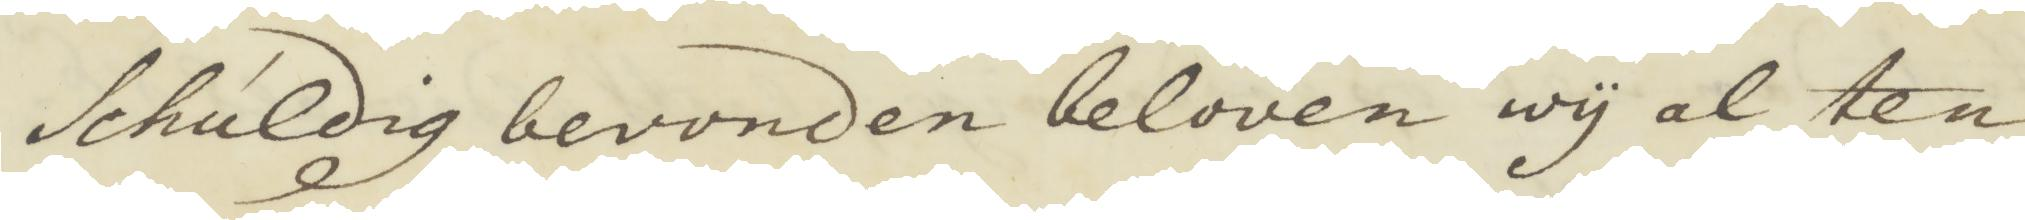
schuldig bevonden beloven wij al ten
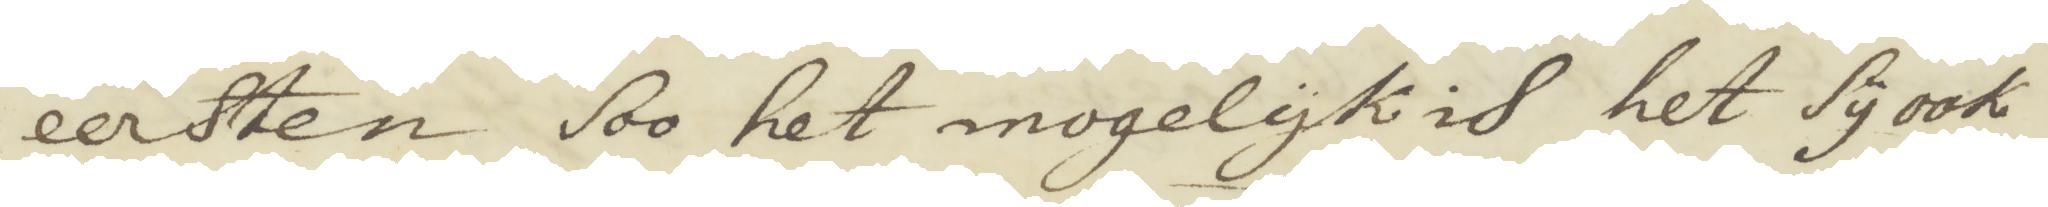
eersten soo het mogelijk is het sij ook
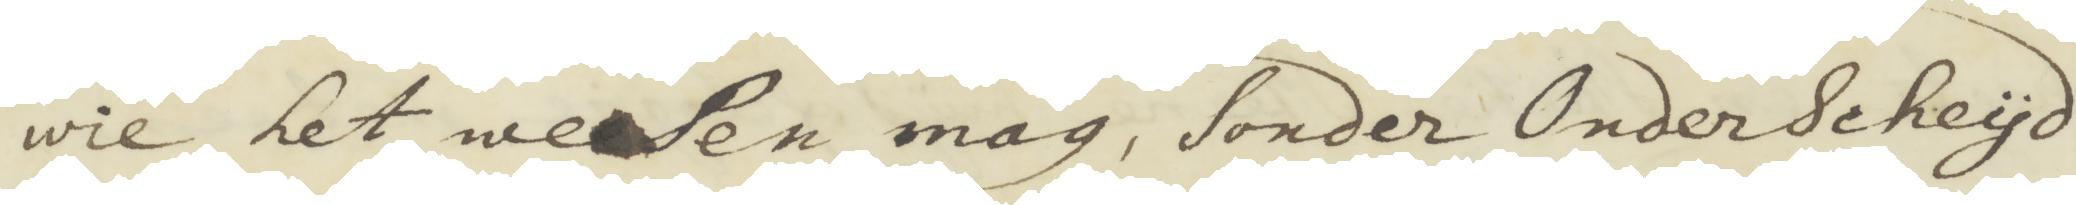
wie het weesen mag, sonder Onderscheijd
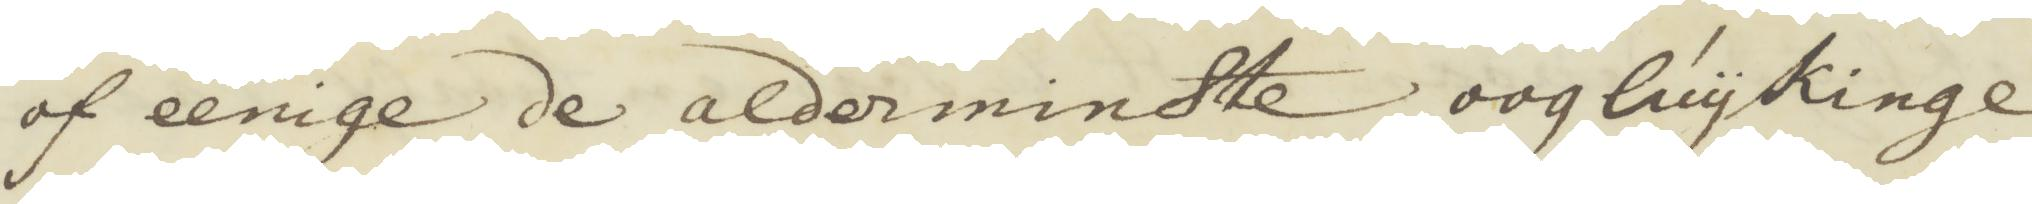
of eenige de alderminste oogluijkinge
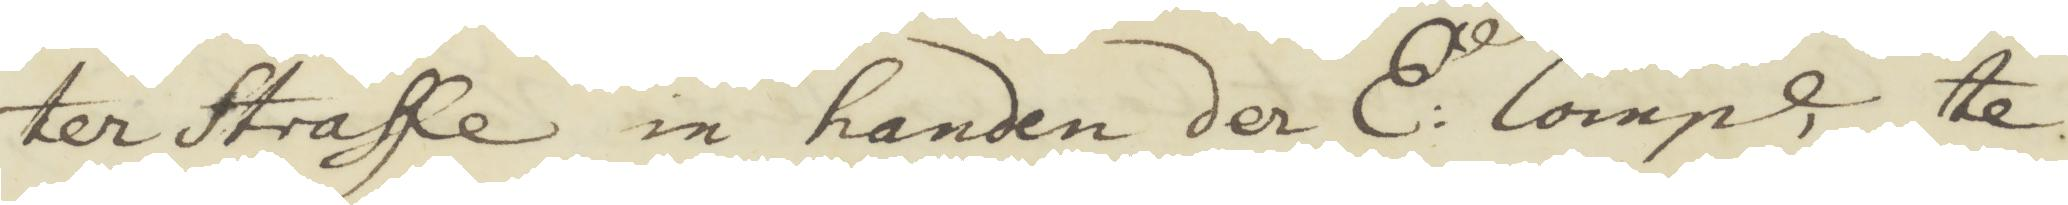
ter straffe in handen der E: Comp,e te
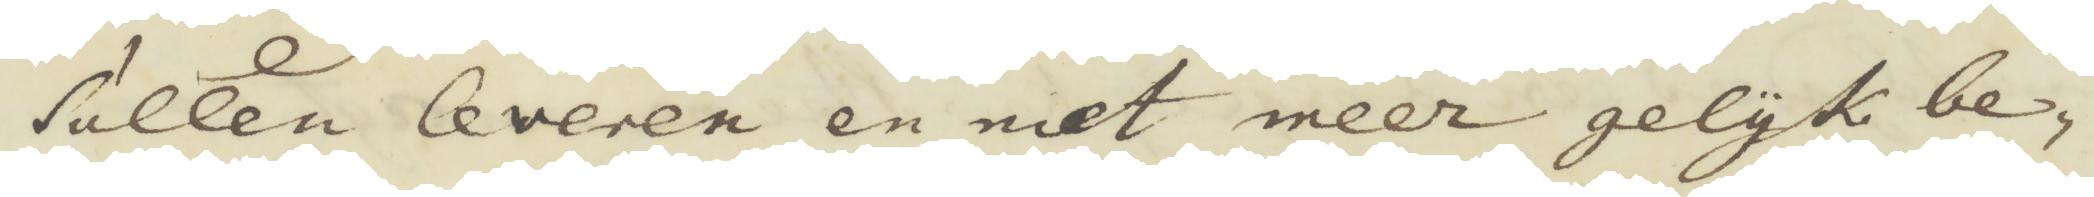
sullen leveren en niet meer gelijk be„
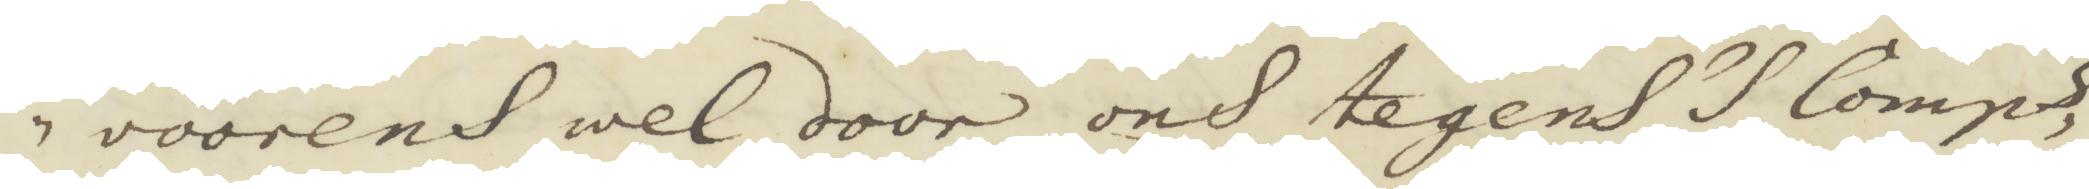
„voorens wel door ons tegens ’S Comp,s
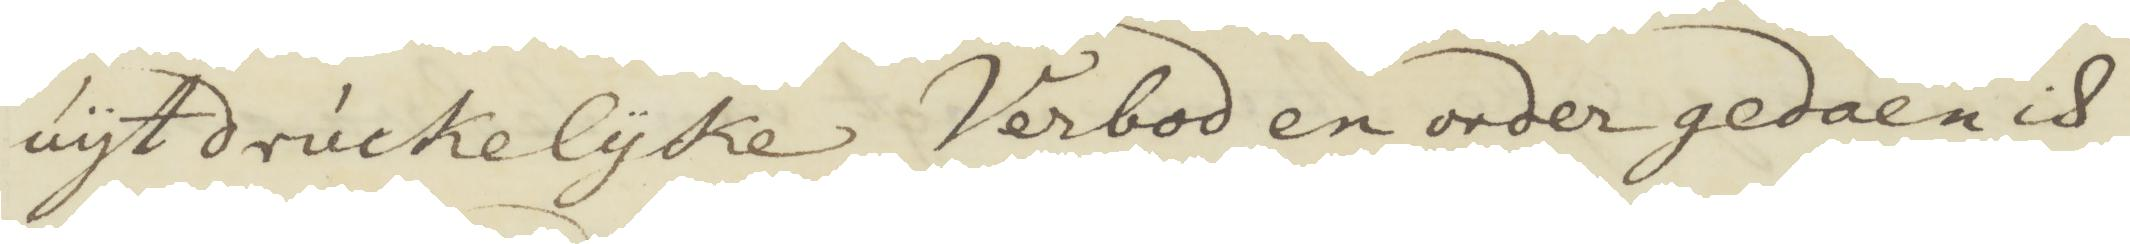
uijtdruckelijke Verbod en order gedaen is
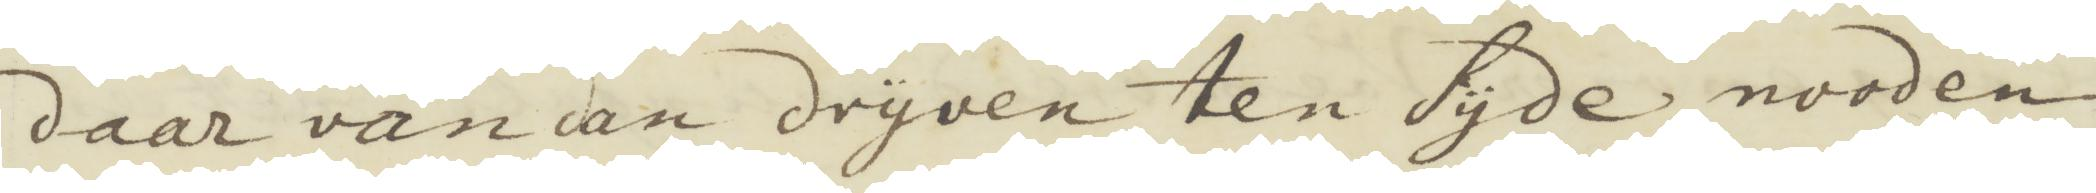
daar van dan drijven ten sijde nooden
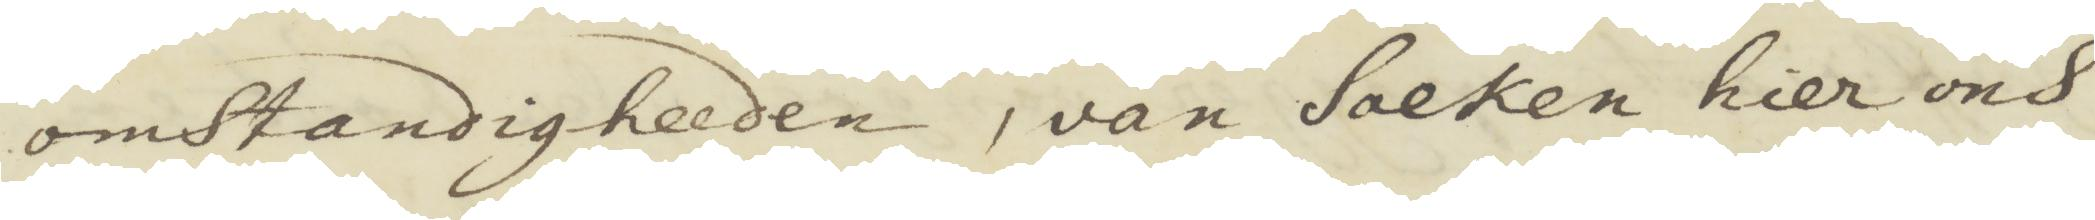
omstandigheeden, van saeken hier ons
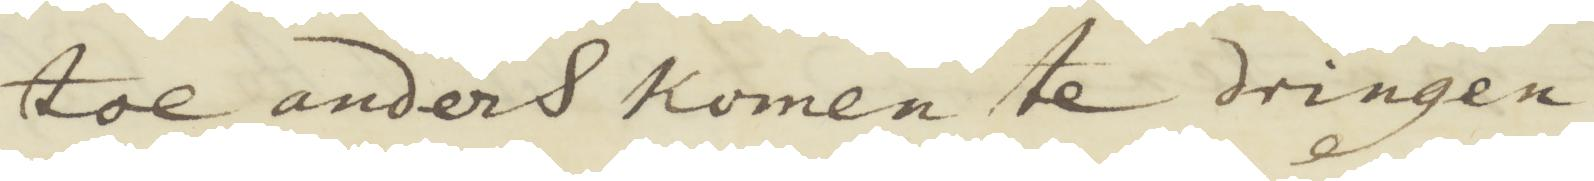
toe anders komen te dringen
